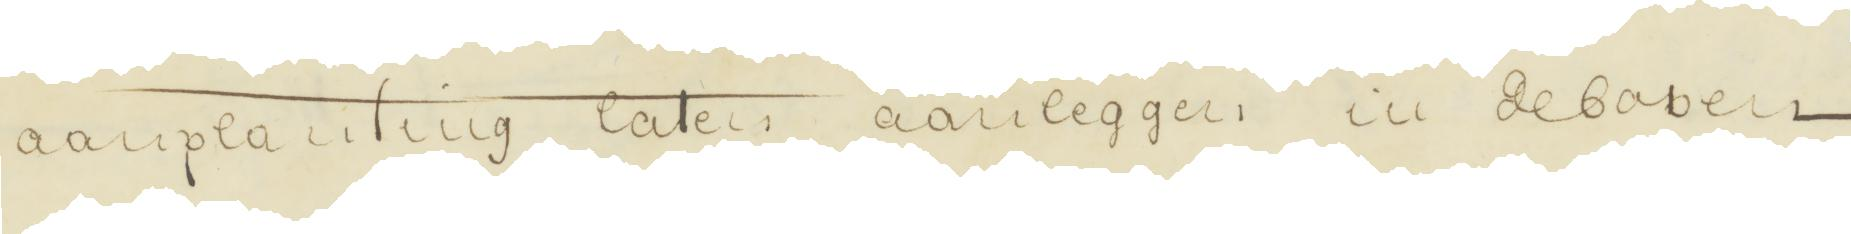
aanplanting laten aanleggen in deboven
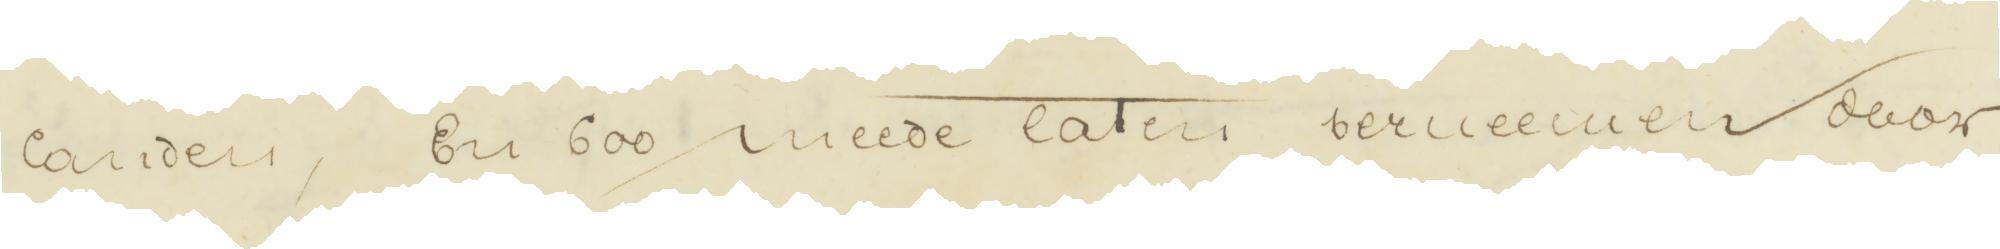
landen, en soo meede laten verneemen daar
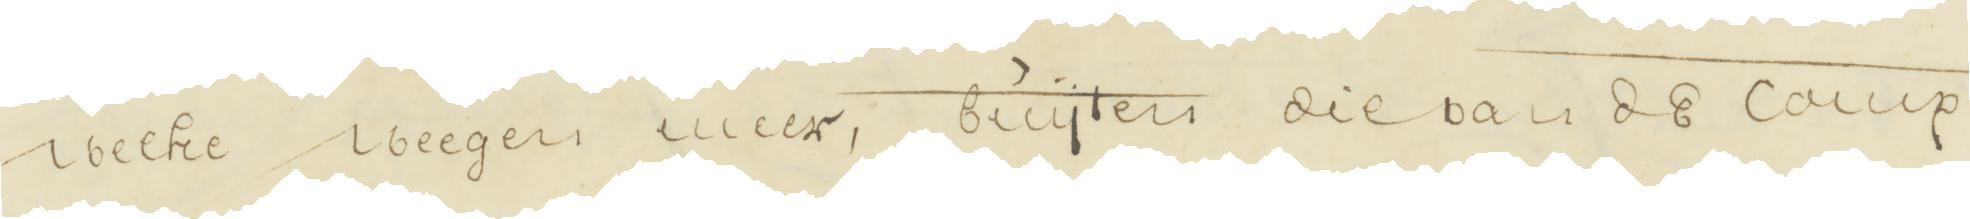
welke weegen meer, buijten die van dE Comp
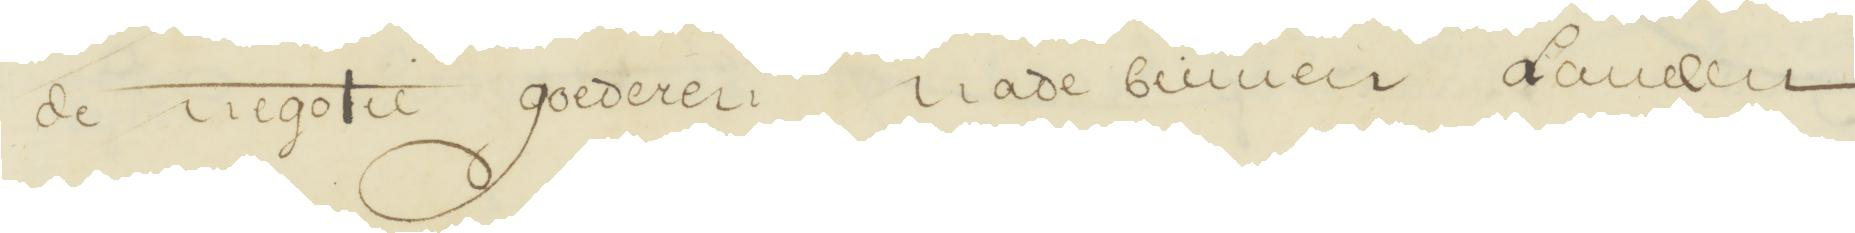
de negotie goederen nade binnen Landen
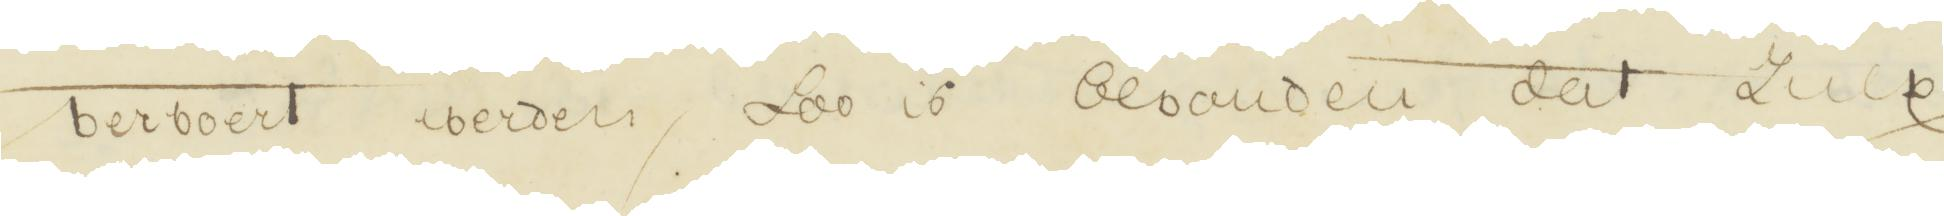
vervoert werden, Soo is bevonden dat zulx
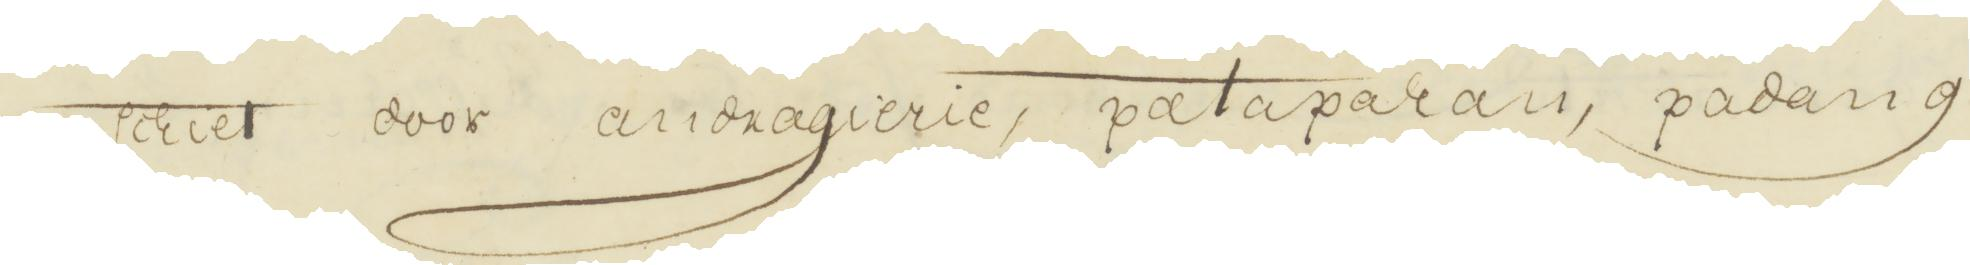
geschiet door andragierie, patapahan, padang
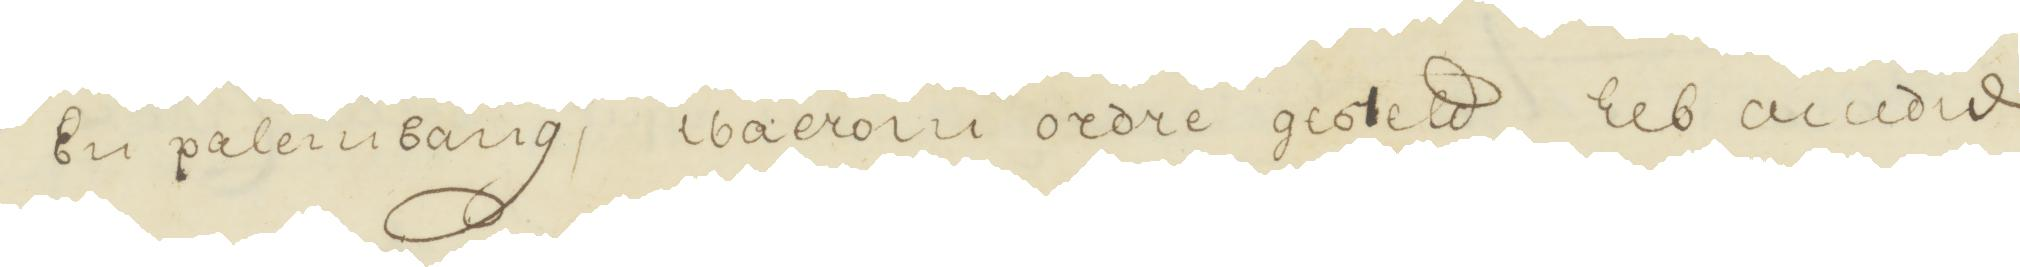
en palembang, waerom ordre gesteld heb amdie
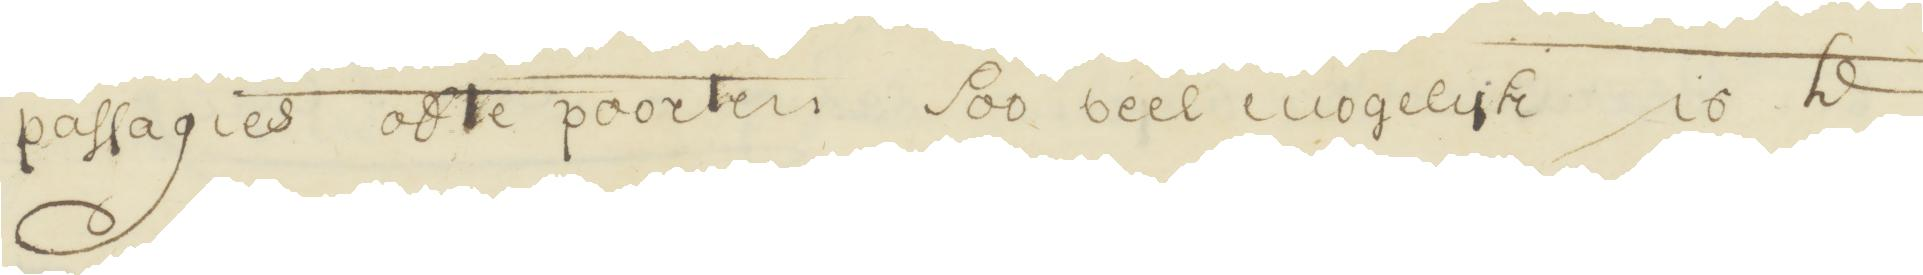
passagies ofte poorten soo veel mogelijk is te
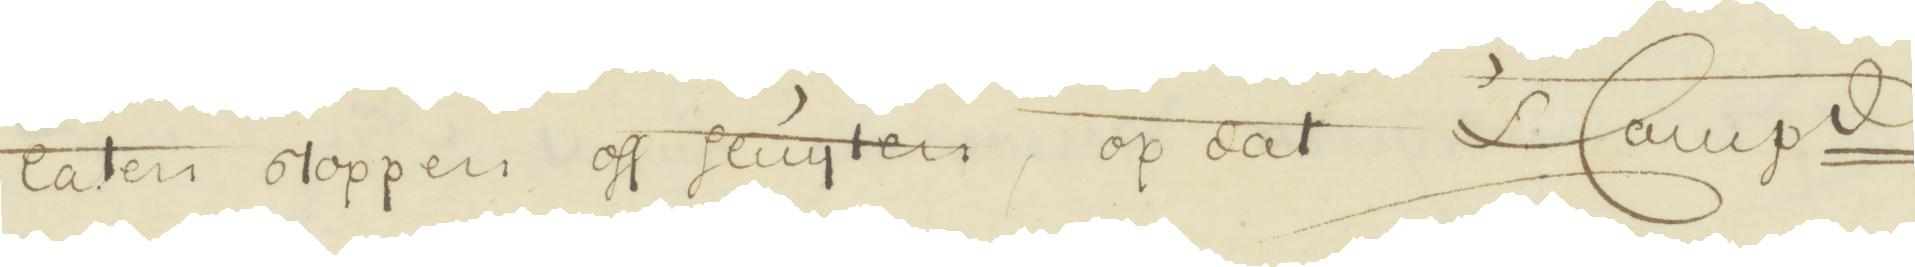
laten stoppen off sluyten, op dat 's Comp=e
